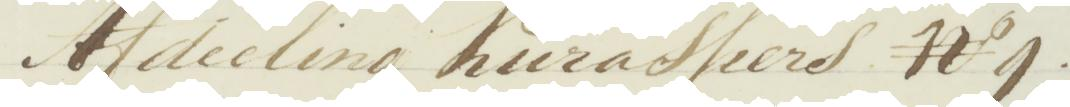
Afdeeling Kurassiers No 9.
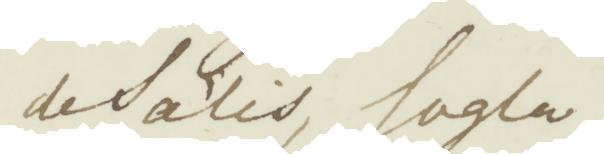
de Salis, soglio.
